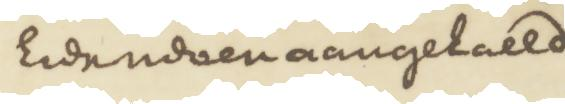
hierneven aangehaeld
